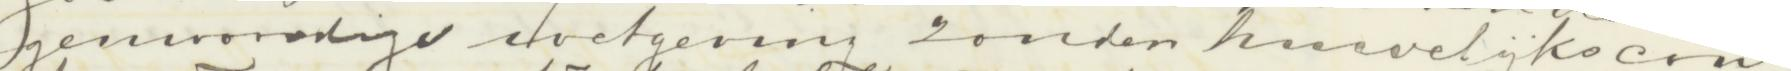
genwoordige wetgeving zonder huwelijks con
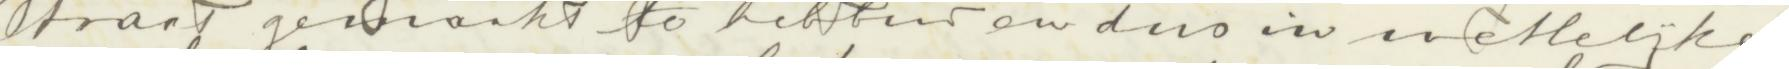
tract gemaakt te hebben en dus in wettelijke
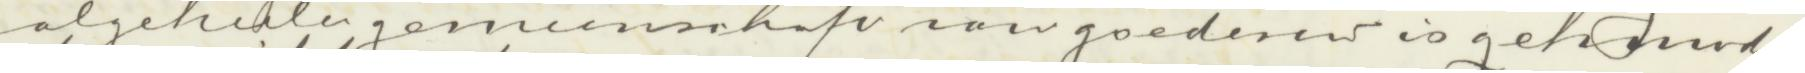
algeheele gemeenschap van goederen is gehuwd.
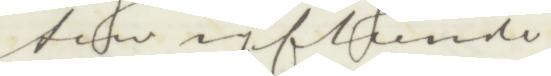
ten vijftiende
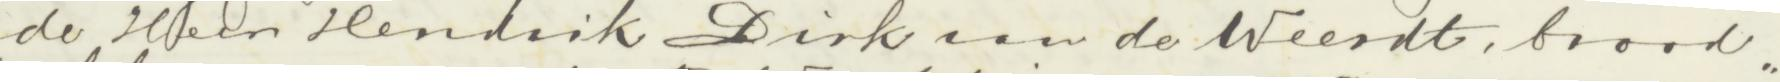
de Heer Hendrik Dirk van de Weerdt, brood„
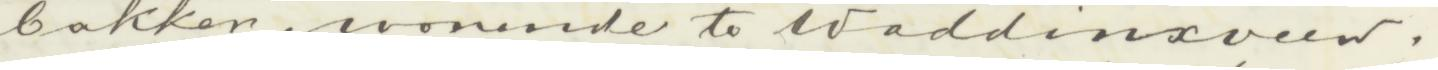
bakker, wonende te Waddinxveen.
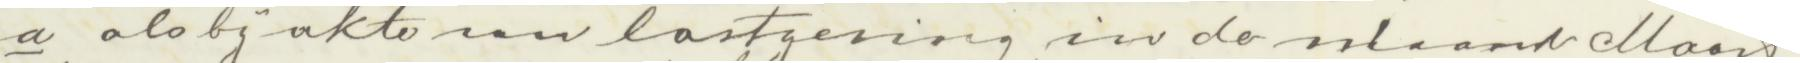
a als bij akte van lastgeving in de maand Maart
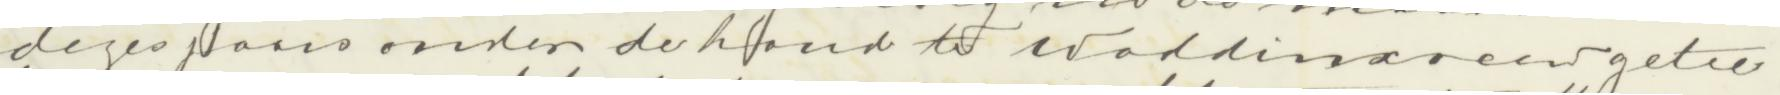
dezes jaars onder de hand te Waddinxveen getee
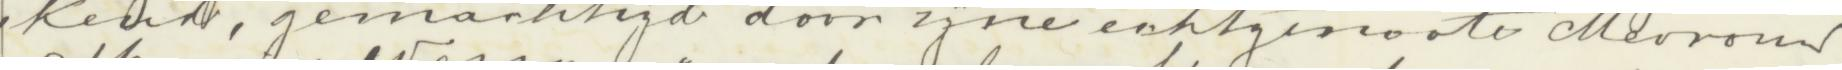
kent, gemachtigd door zijne echtgenoote Mevrouw
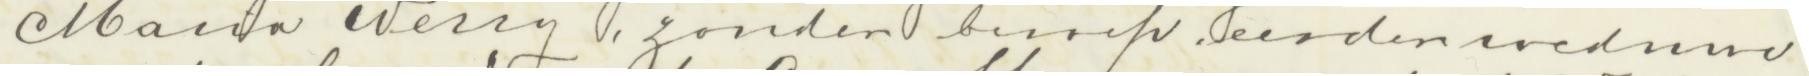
Maria Werry, zonder beroep, eerder weduwe
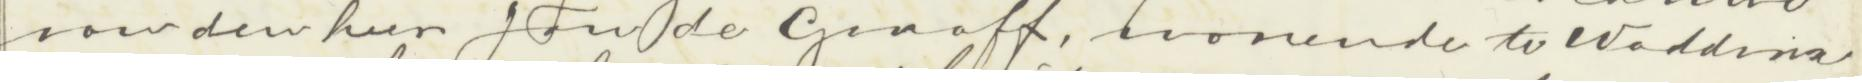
van den heer Jan de Graaff, wonende te Waddinx
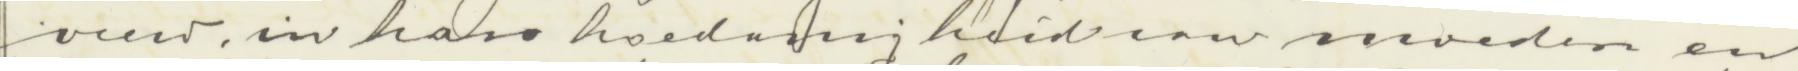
veen, in hare hoedanigheid van moeder en
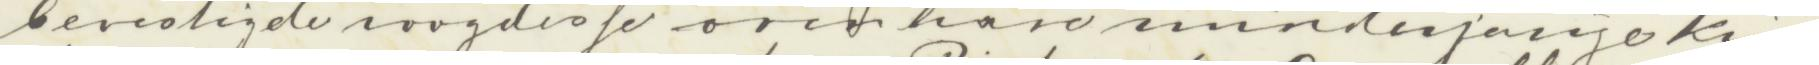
bevestigde voogdesse over hare minderjarige kin
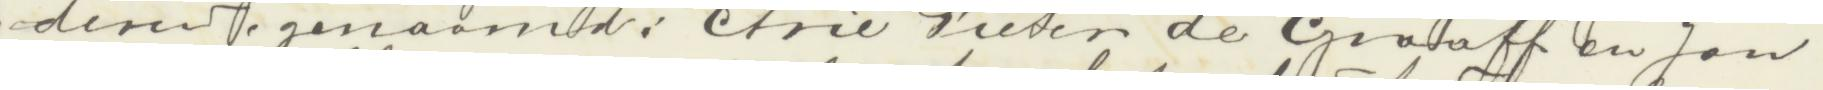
deren genaamd: Arie Pieter de Graaff en Jan
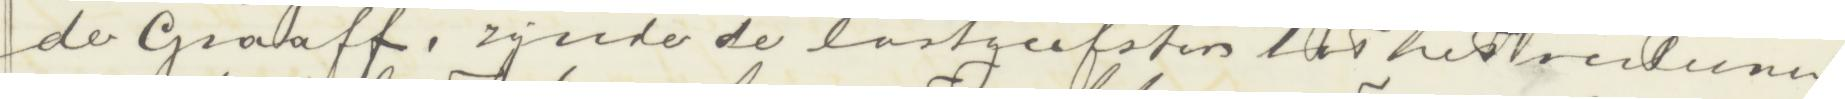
de Graaff, zijnde de lastgeefster tot het verleenen
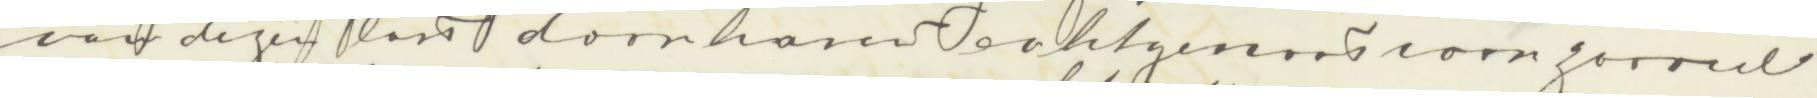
van dezen last door haren echtgenoot voor zooveel
